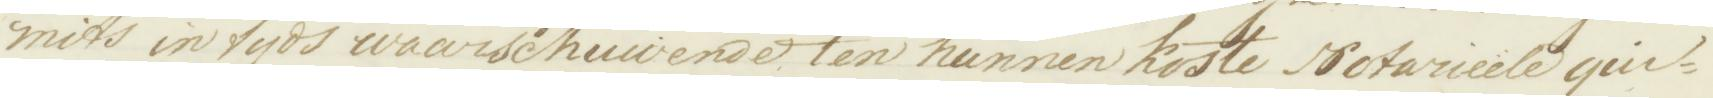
mits in tyds waarschuwende, ten hunnen koste Notarieële qui=
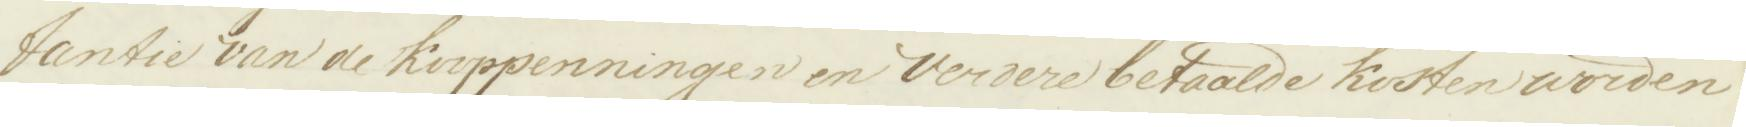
tantie van de kooppenningen en verdere betaalde kosten worden
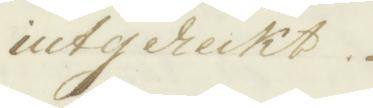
uitgereikt.
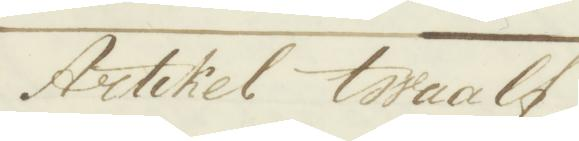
Artikel twaalf
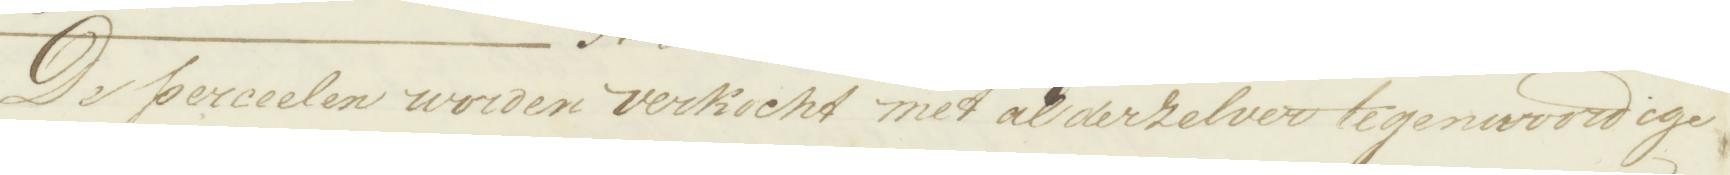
De perceelen worden verkocht met al derzelver tegenwoordige
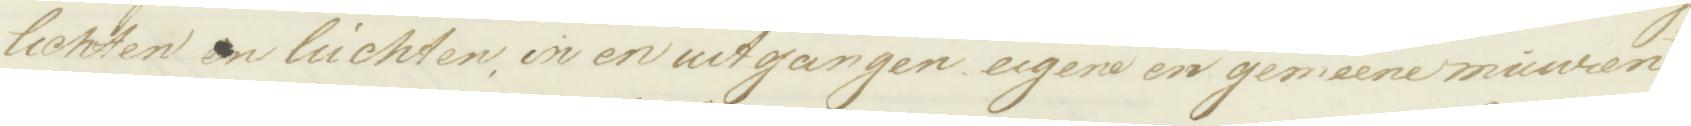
lichten en luchten, in en uitgangen, eigene en gemeene muuren
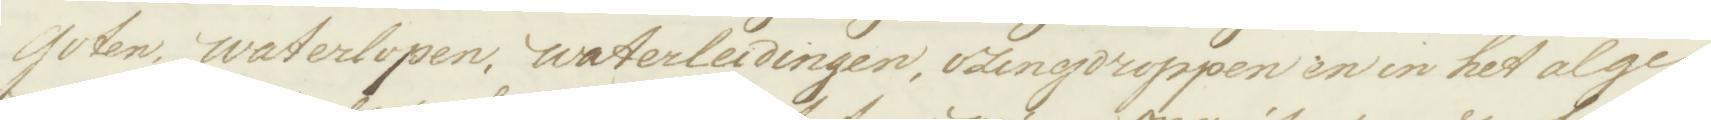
goten, waterlopen, waterleidingen, ozingdroppen en in het alge=
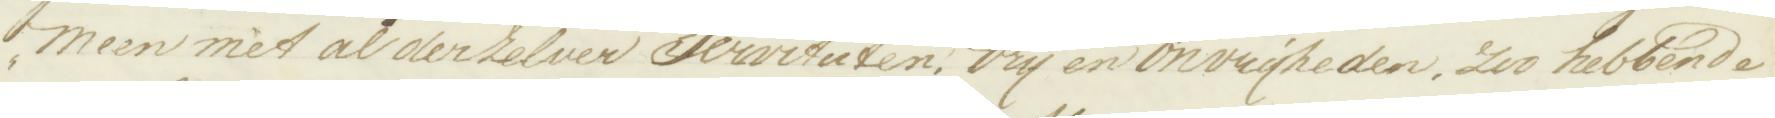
„meen met al derzelver servituten, vrij en onvrijheden, zoo hebbende
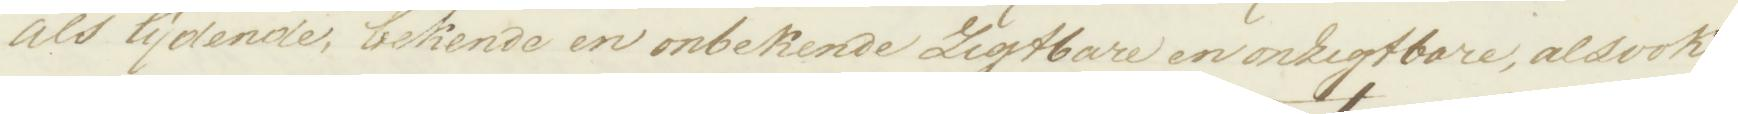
als lijdende, bekende en onbekende zigtbare en onzigtbare, alsook
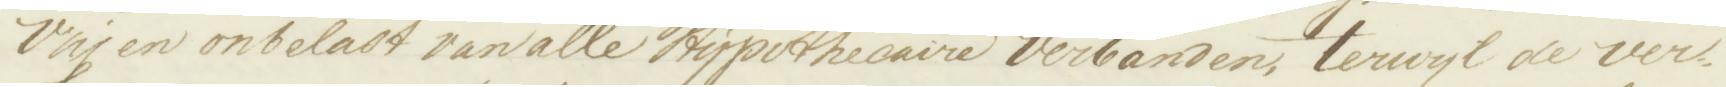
Vrij en onbelast van alle Hijpothecaire verbanden, terwyl de ver„
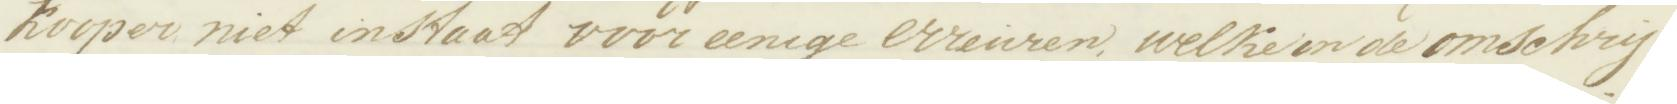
kooper niet instaat voor eenige erreuren, welke in de omschrij
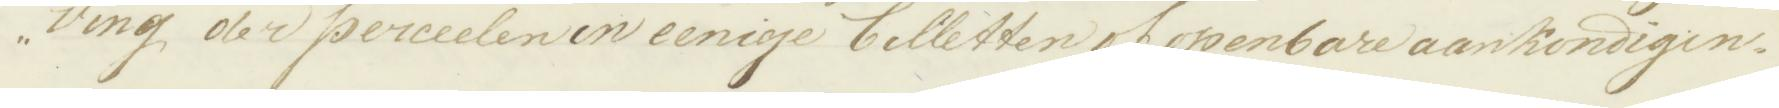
„ving der perceelen in eenige billetten of openbare aankondigin„
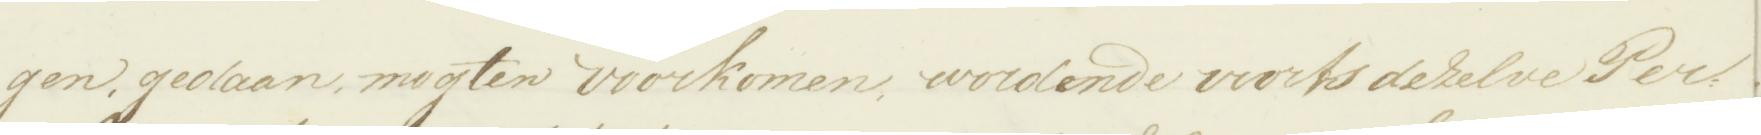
gen, gedaan, mogten voorkomen, wordende voorts dezelve Per
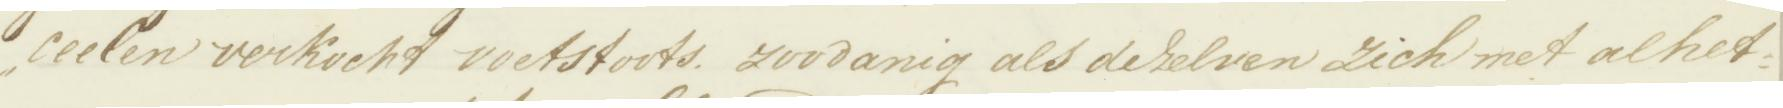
„ceelen verkocht voetstoots. zoodanig als dezelven zich met alhet„
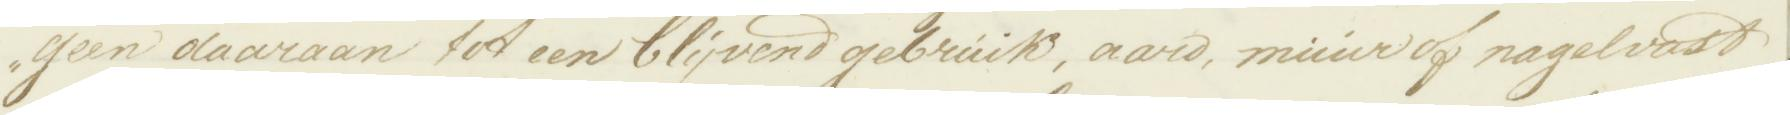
„geen daaraan tot een blijvend gebruik, aard, muur of nagelvast
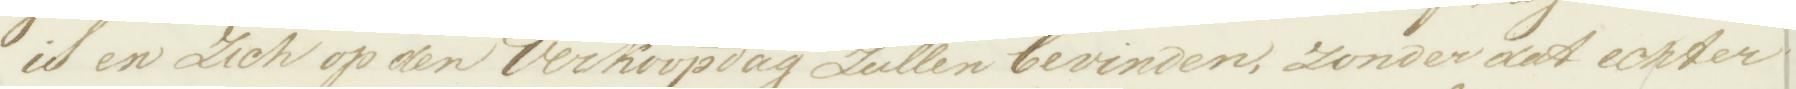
is en zich op den verkoopdag zullen bevinden, zonder dat echter
